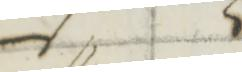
_„o 5
